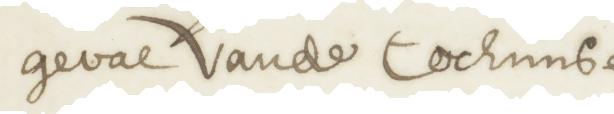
geval vande Cochimse
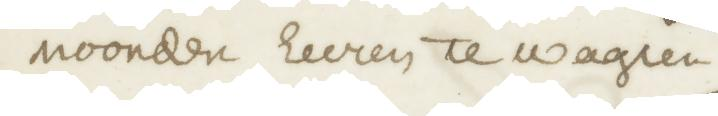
noorder heeren te wagten
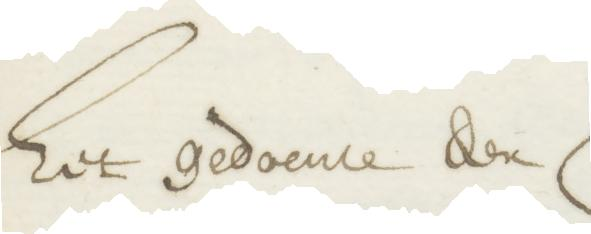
het gedoente der
